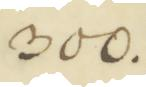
300.
